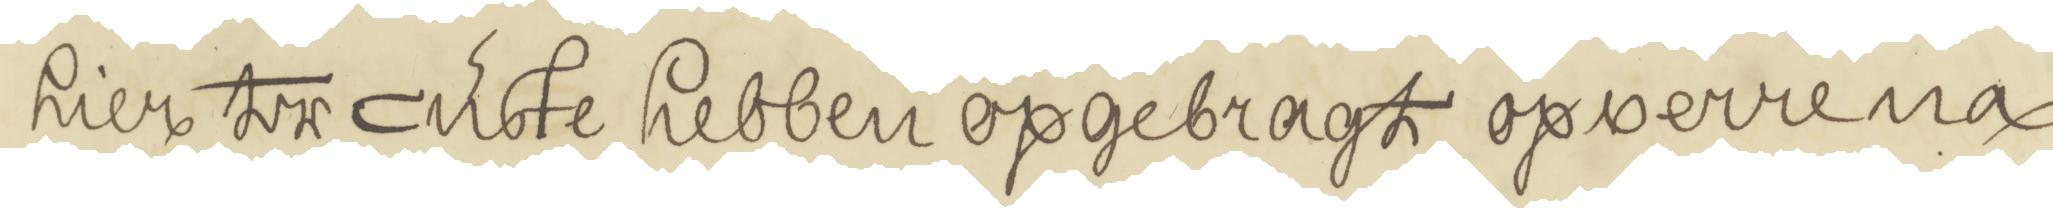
hier ter custe hebben opgebragt op verre na
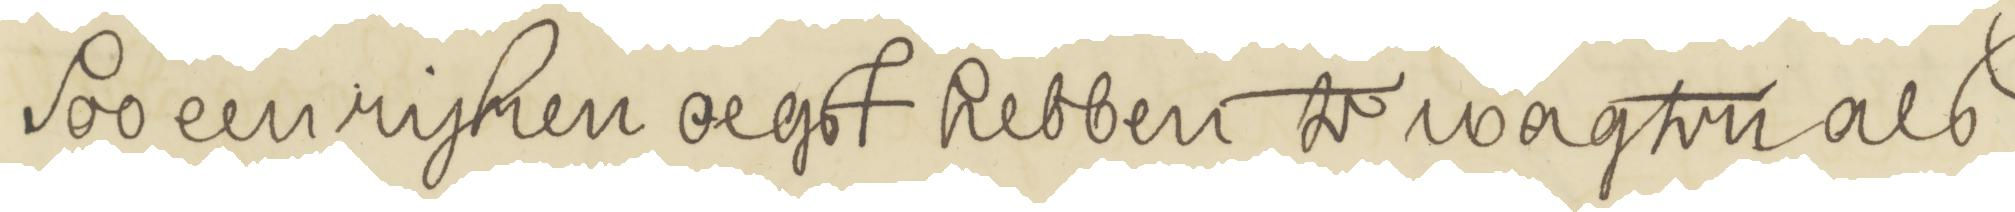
soo een rijken oegst hebben te wagten als
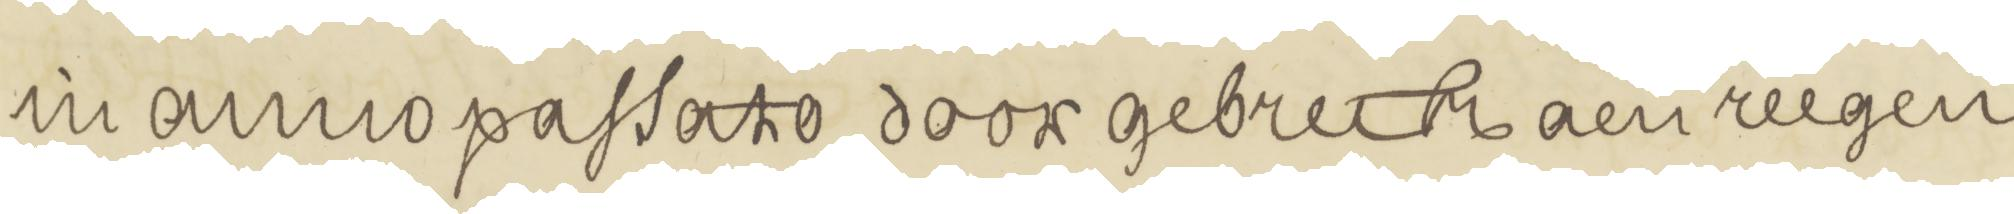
in anno passato, door gebreck aen reegen
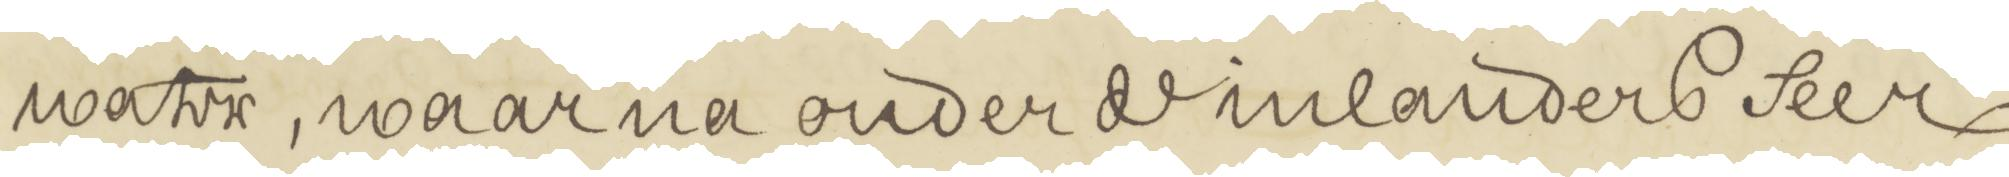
water, waarna onder de inlanders seer
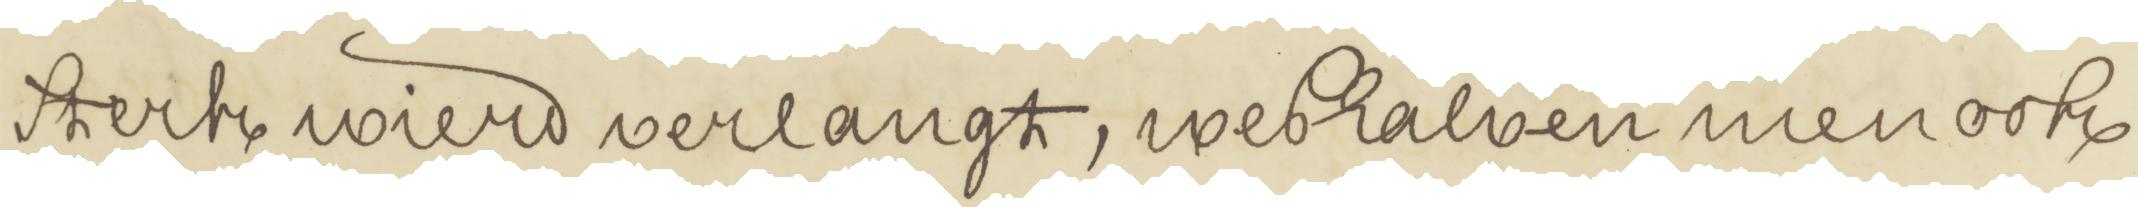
sterk wierd verlangt, weshalven men ook
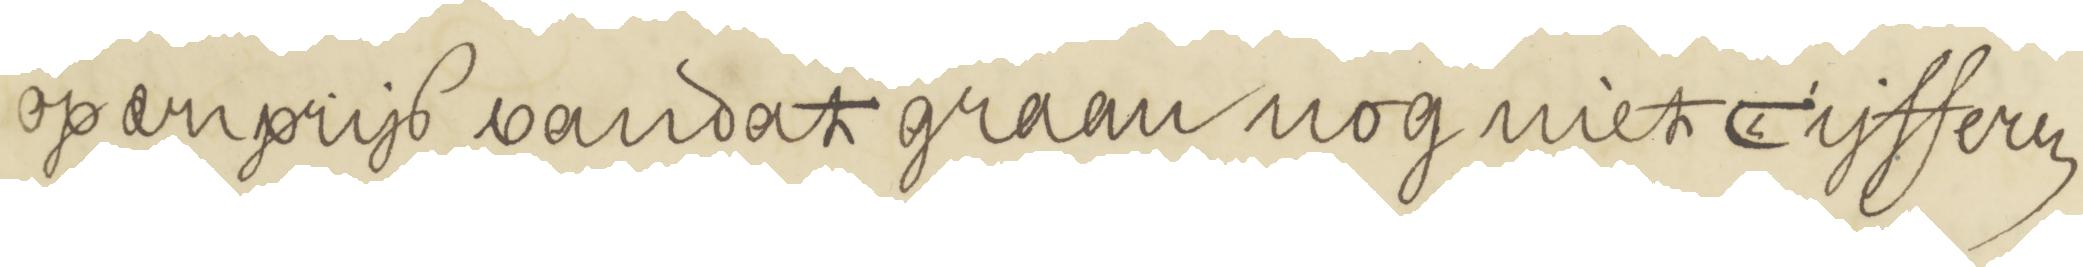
op den prijs vandat graan nog niet cijfferen
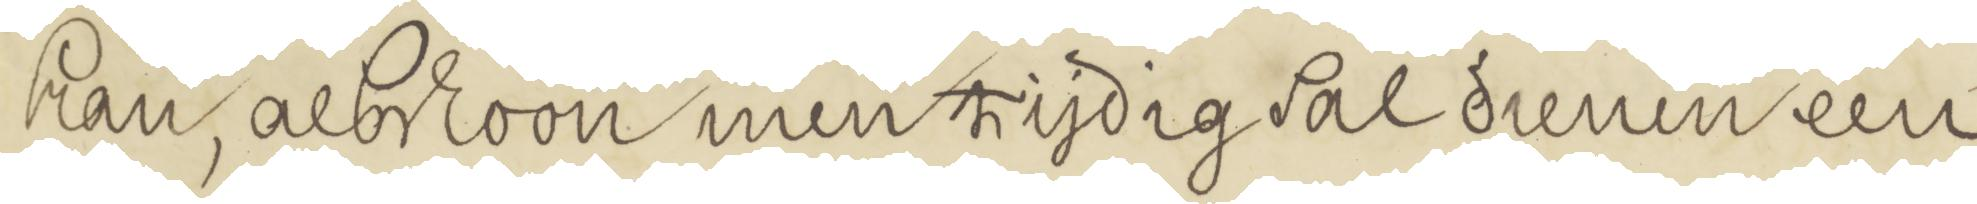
kan, alschoon men tijdig sal dienen een
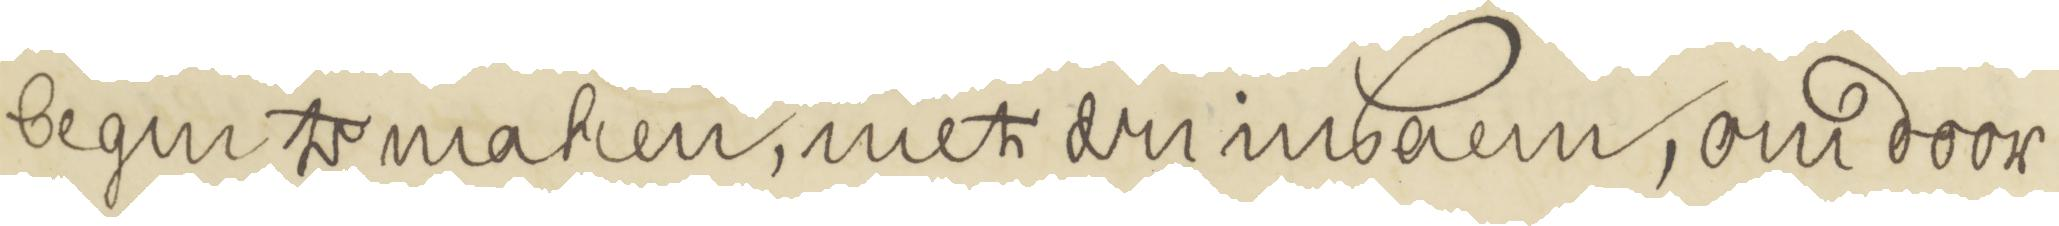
begin te maken, met den insaem, om door
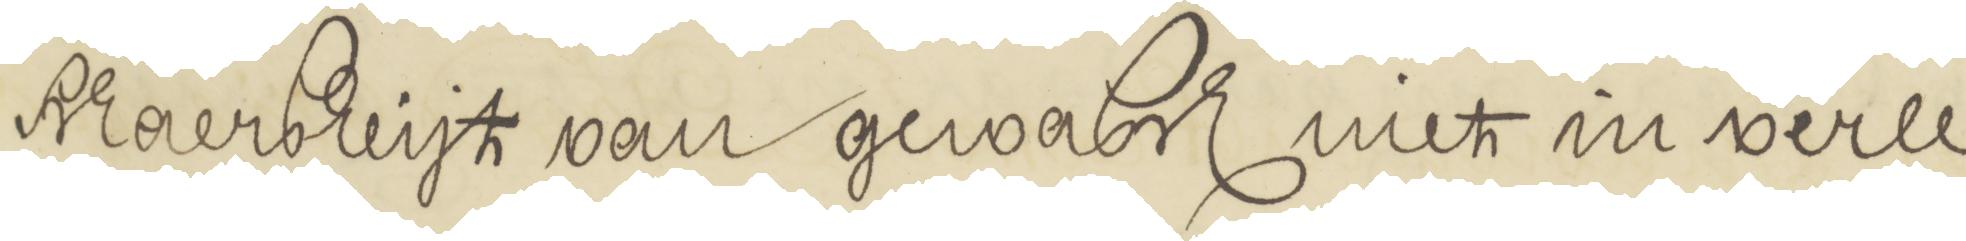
schaersheijt van gewasch niet in verle
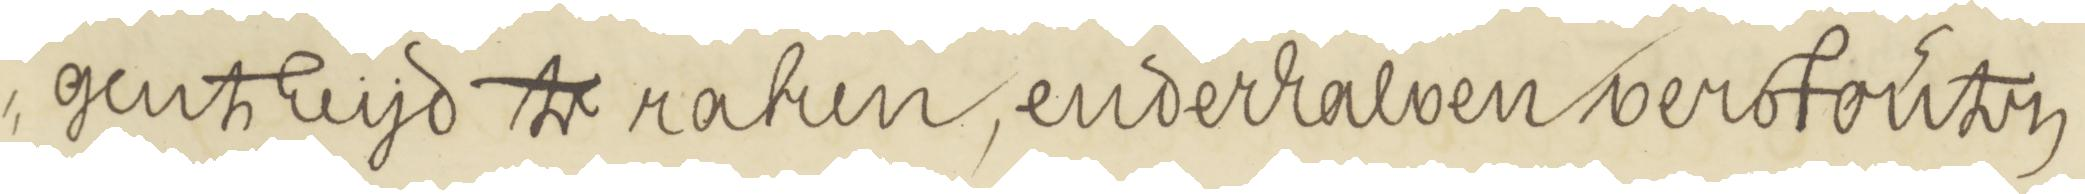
„gentheijd te raken, enderhalven verstouten
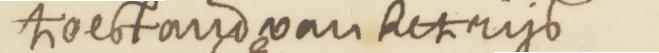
toestand van het rijs
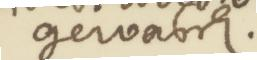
gewasch.
